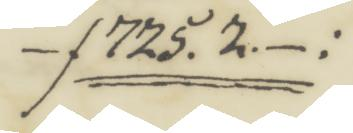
–ƒ775. 2.— :
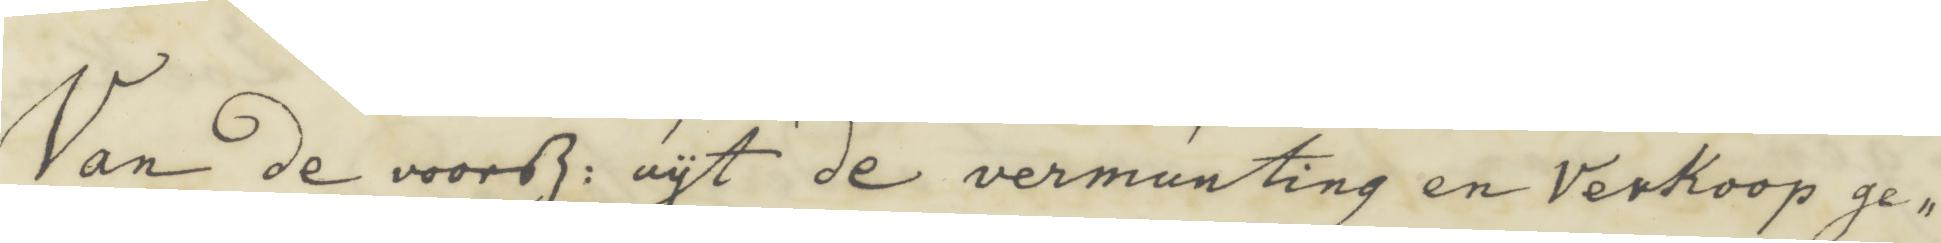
Van de voorsz: uijt de vermunting en verkoop ge„
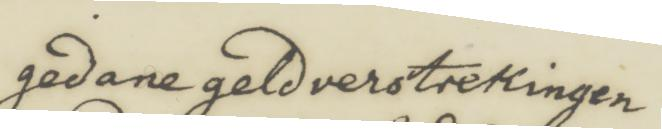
gedane geld verstrekingen
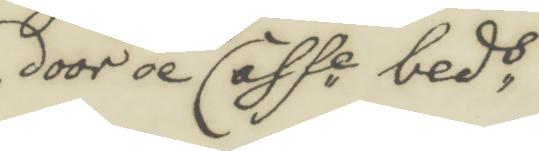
door de Cass„e bed„s
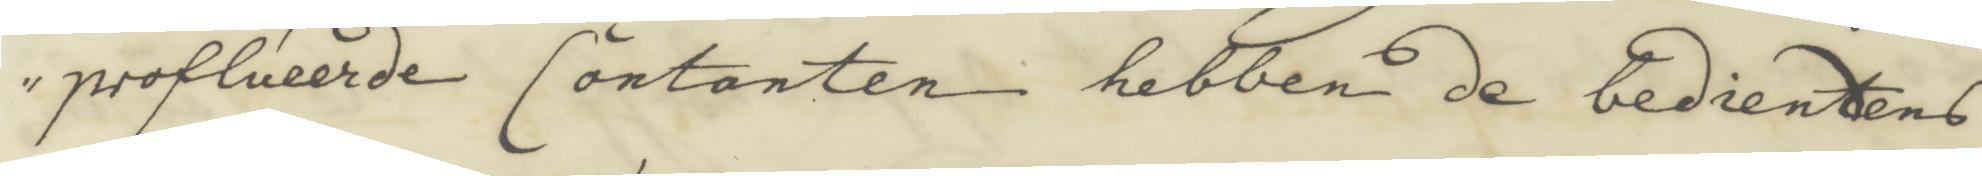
„proflueerde Contanten hebben de bedientens
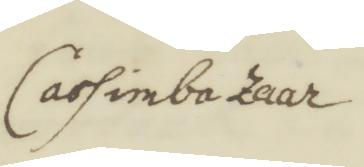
Cassimbazaar
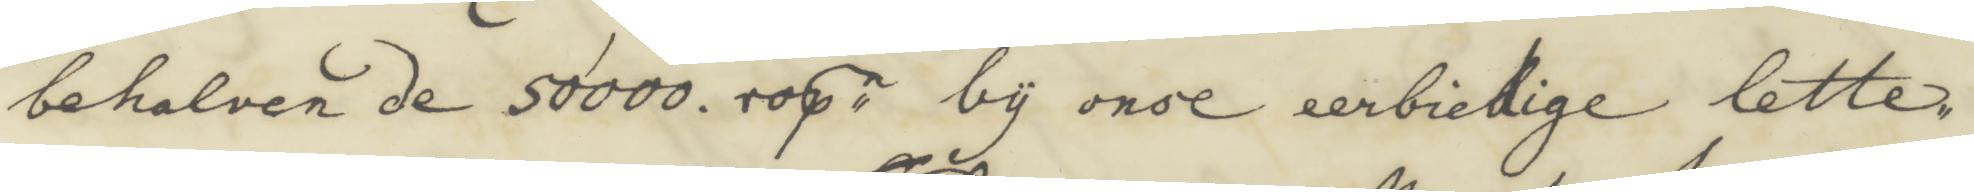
behalven de 50'000. rop„n bij onse eerbiedige lette„
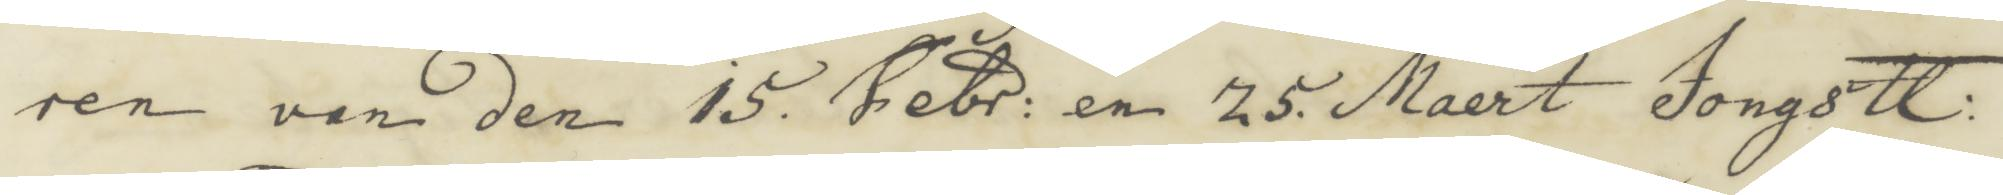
ren van den 15. Febr: en 25. Maert Jongstl:
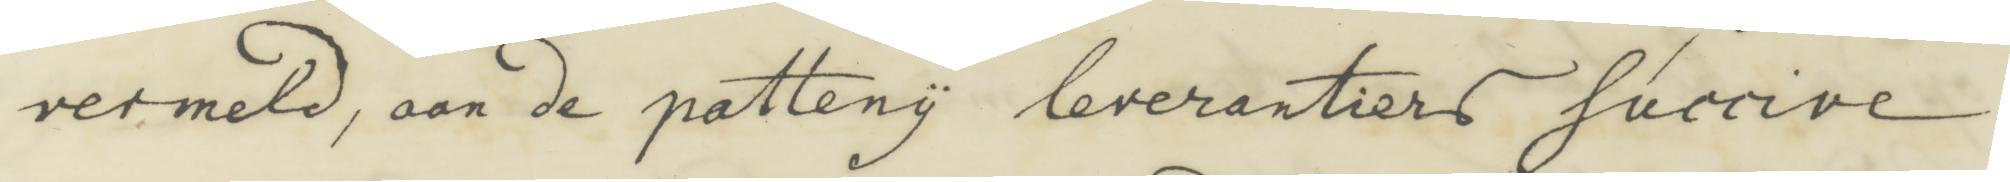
vermeld, aan de pattenij leverantiers succive
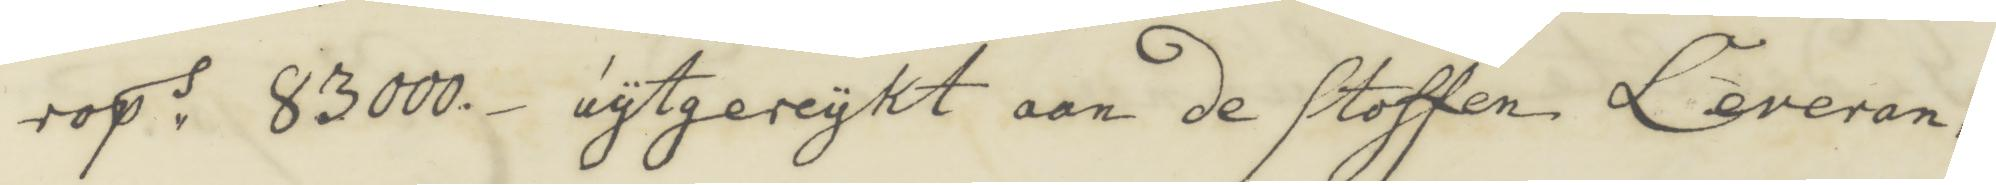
rop„s 83000.– uijtgereijkt aan de stoffen Leveran„
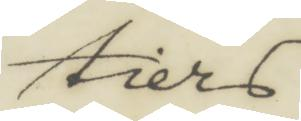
tiers
